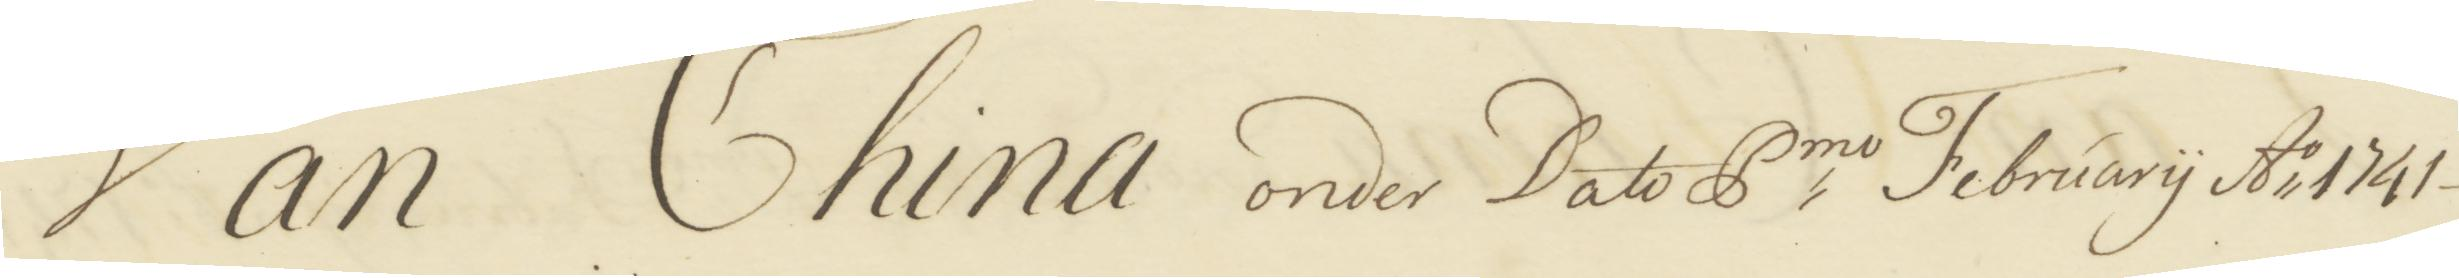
Van China onder Dato P„mo Februarij A„o 1741 —
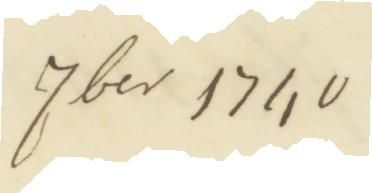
7ber 1740
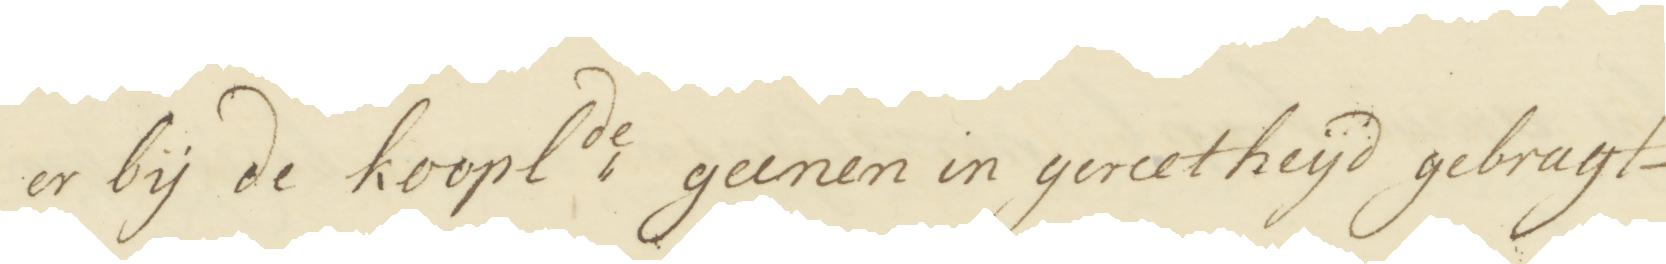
en bij de koopl„de geenen in gereetheijd gebragt-
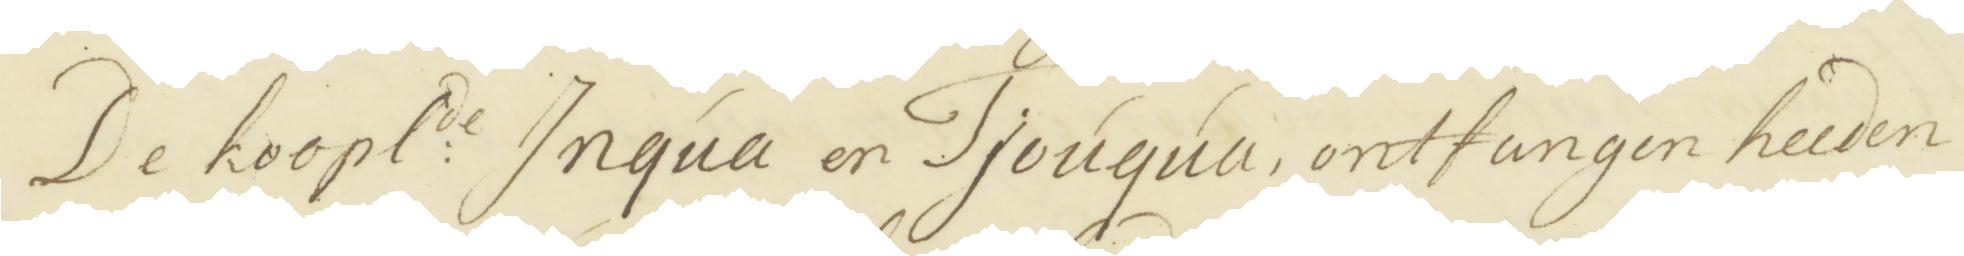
De koopl:de Inqua en Tjouqua, ontfangen heeden
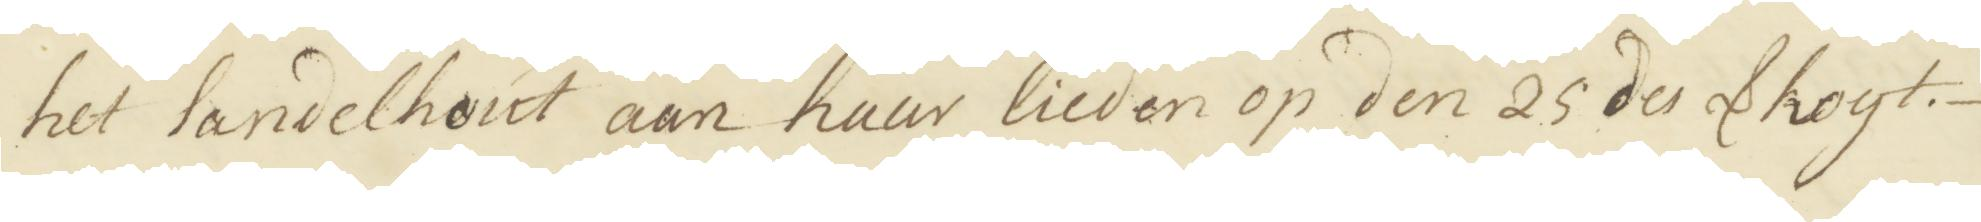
het sandelhout aan haar lieden op den 25 de verkogt.—
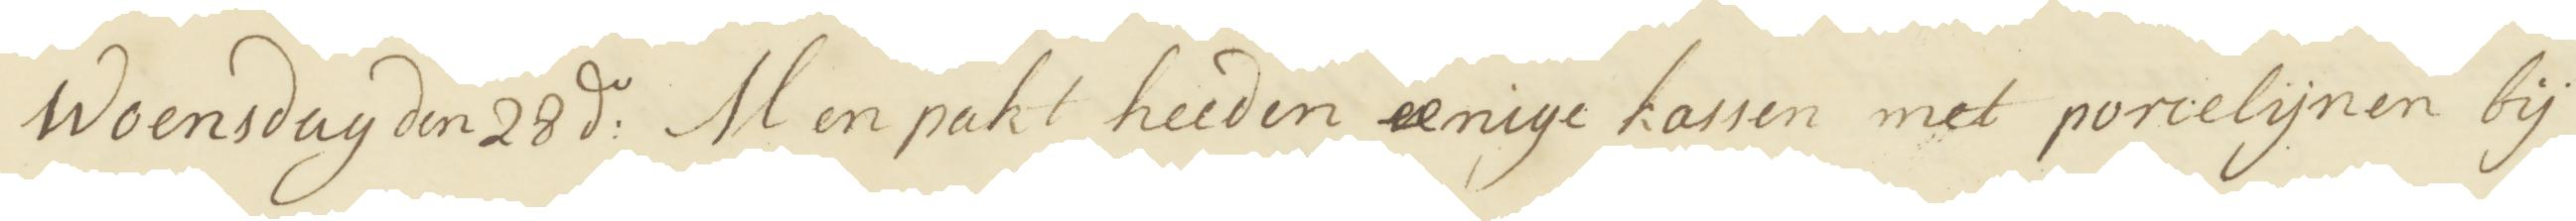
Woendag den 28 d:o Men pakt heeden eenige kassen met porcelijnen bij
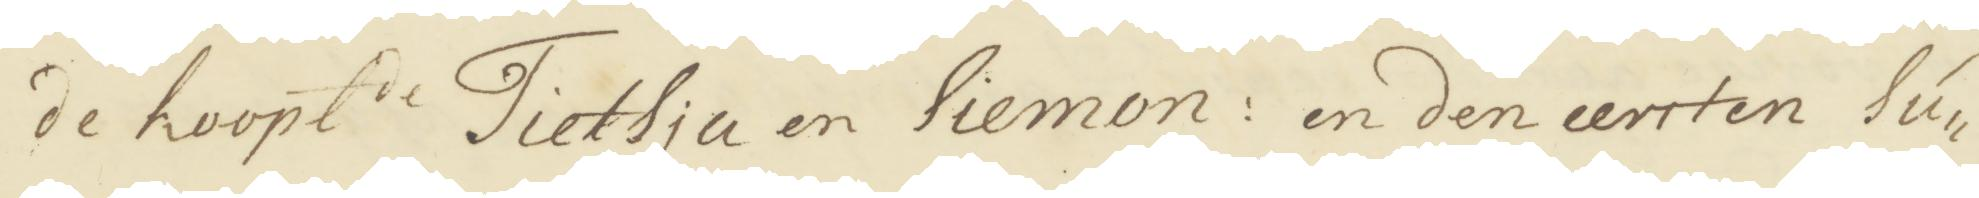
de kooplde Tietsja en siemon: en den eersten su„
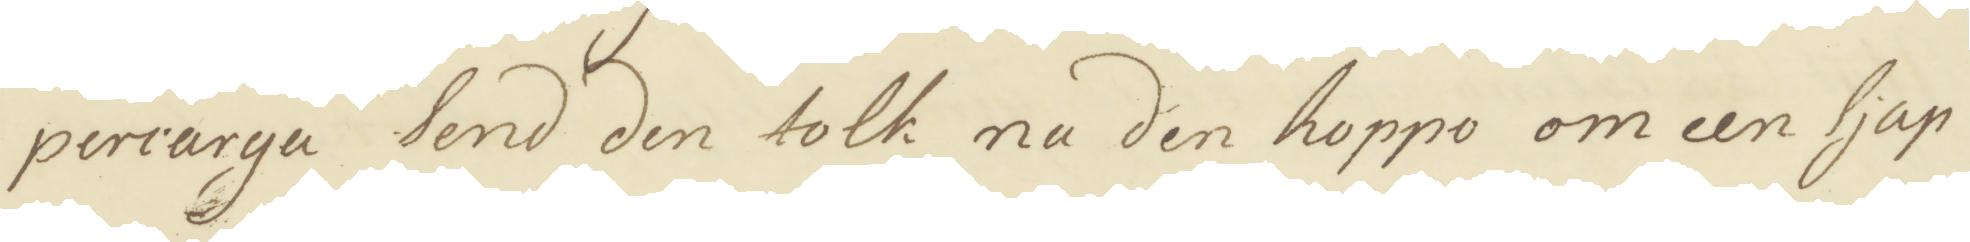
percarga send den tolk na den hoppo om een sjap
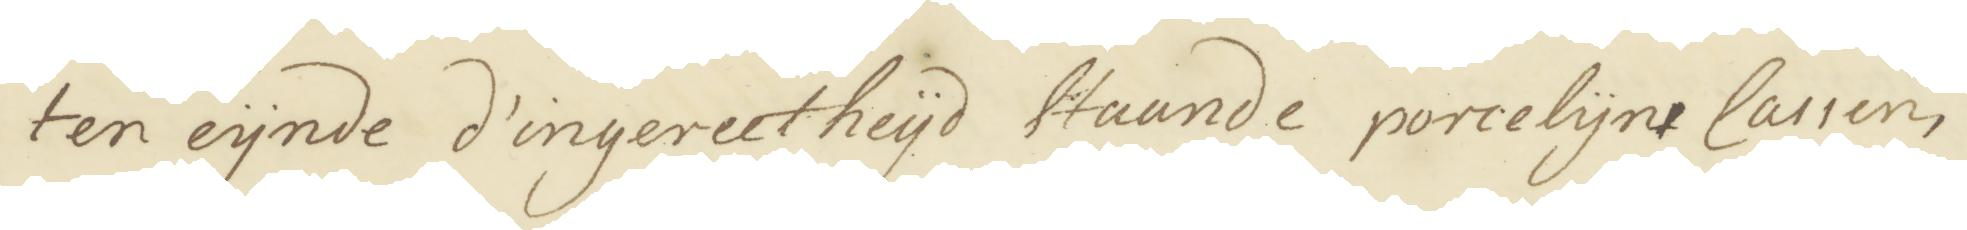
ten eijnde d'ingereetheijd staande porcelijne Cassen,
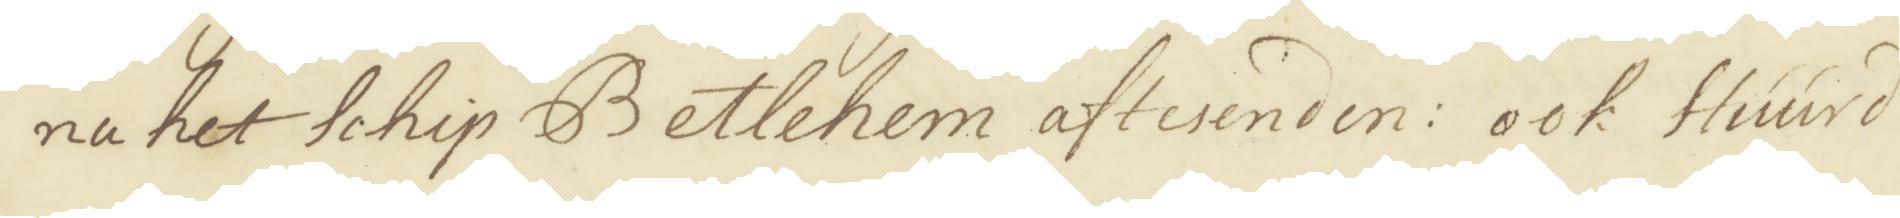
na het schip Betlehem aftesenden: ook stuurd
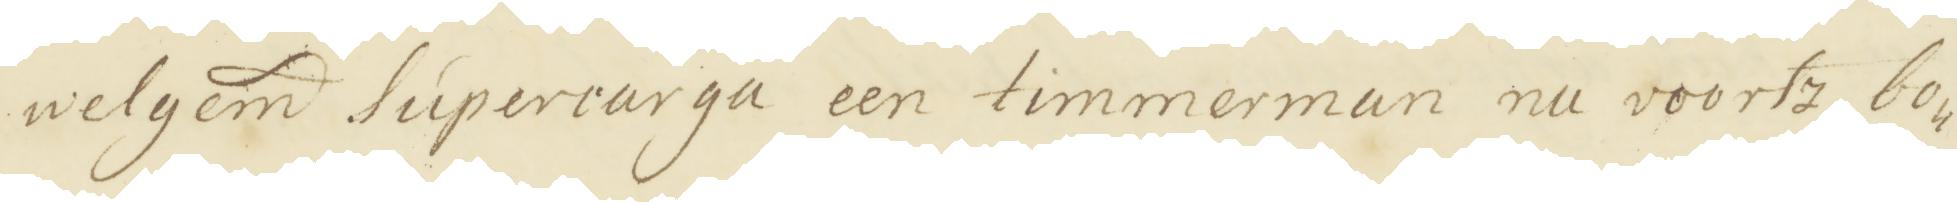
welgem supercarga een timmerman na voorsz bo
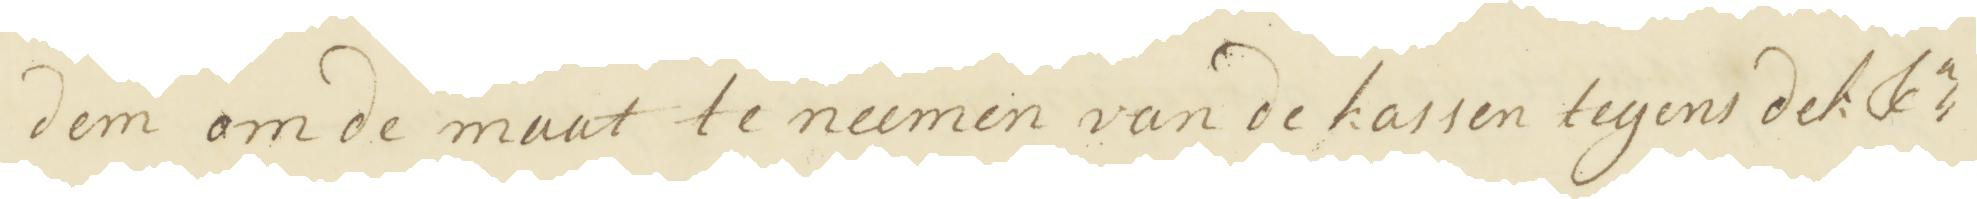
dem om de maat te neemen van de kassen tegens dekk„n
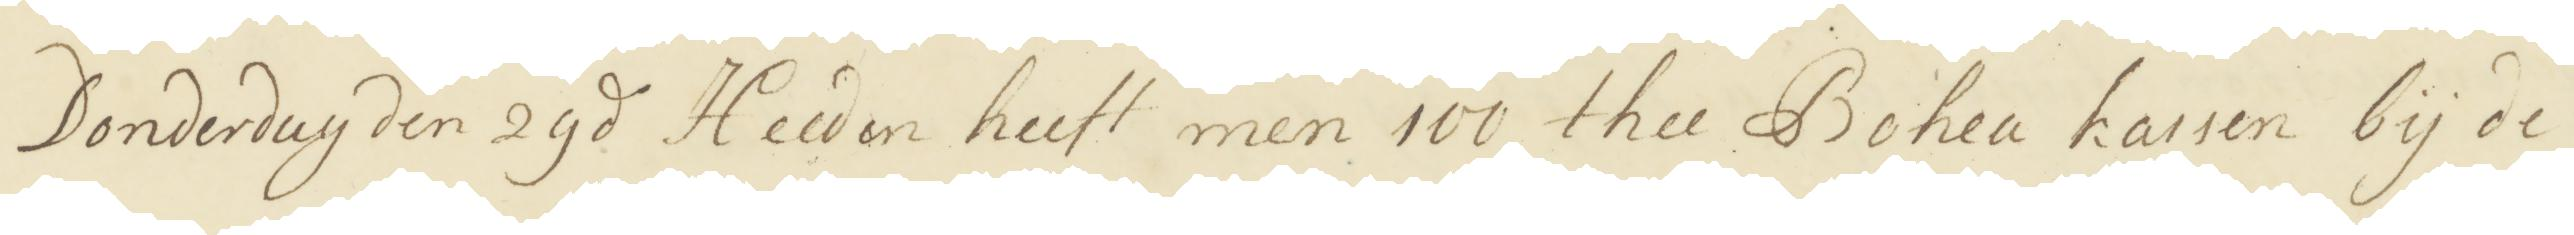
Donderdag den 29 d Heeden heeft men 100 thee Bohea kassen bij de
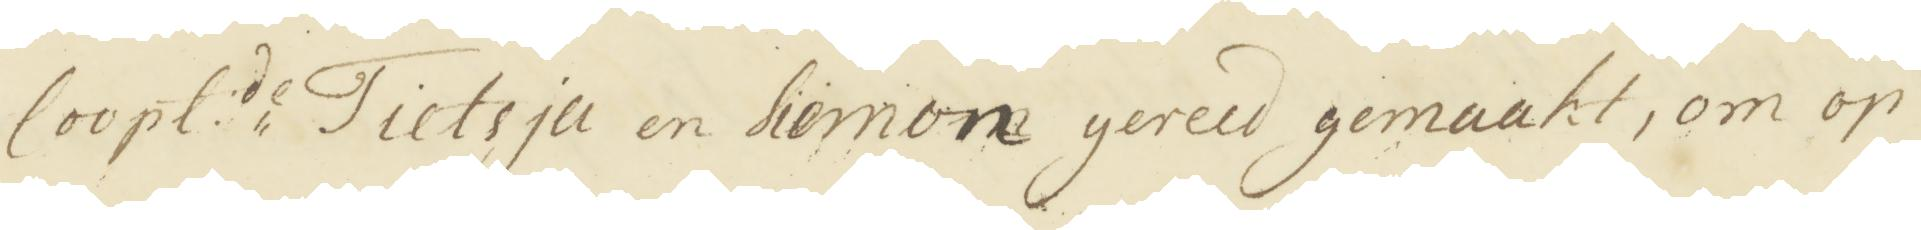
Coopl:„de Tietsja en Siemon gereed gemaakt, om op
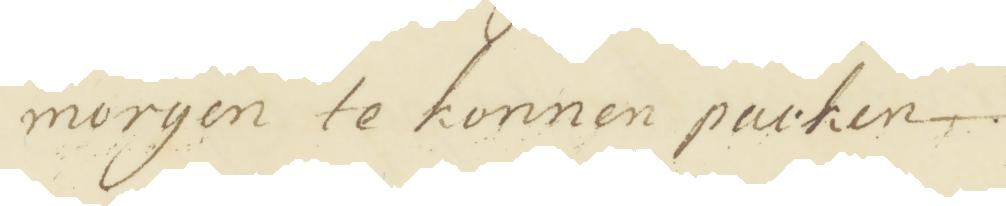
morgen te konnen packen—.
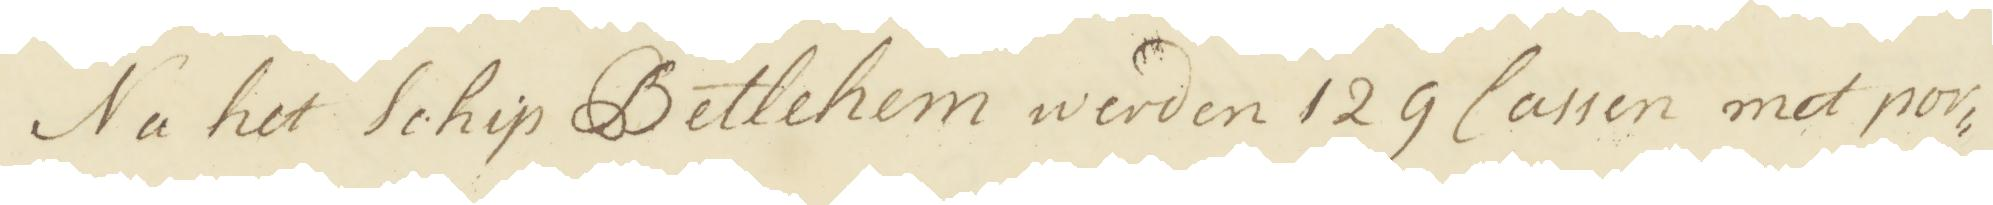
Na het schip Betlehem werden 129 Cassen met por„
